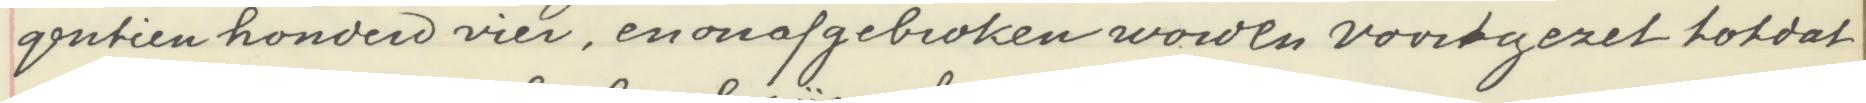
gentien honderd vier, en onafgebroken worden voortgezet tot dat
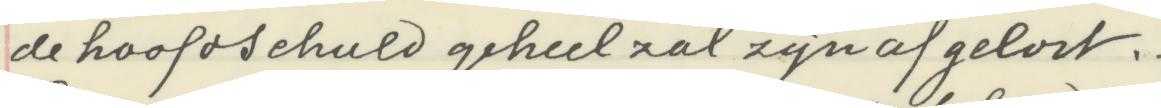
de hoofdschuld geheel zal zijn afgelost.
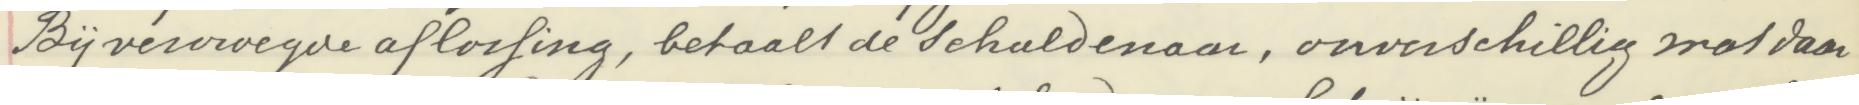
Bij vervroegde aflossing, betaalt de schuldenaar, onverschillig wat daar
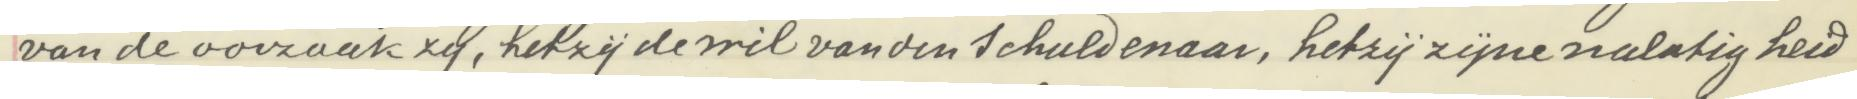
van de oorzaak zy, het zij de wil van den schuldenaar, hetzij zijne nalatigheid
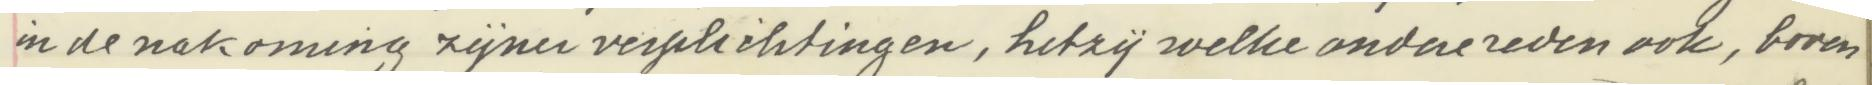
in de nakoming zijner verplichtingen, het zij welke andere reden ook, boven
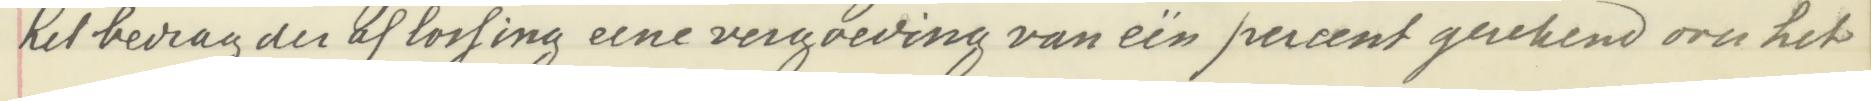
het bedrag der aflossing eene vergoeding van eén percent gerekend over het
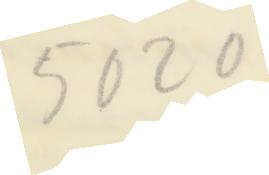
5020
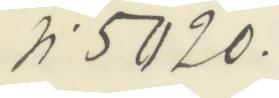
n 5020.
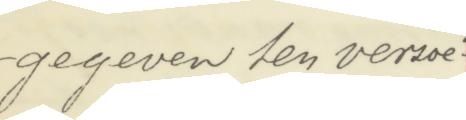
gegeven ten verzoe.
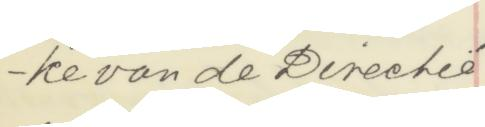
-ke van de Directie
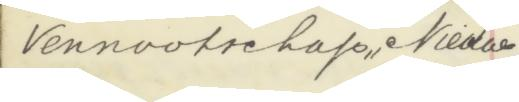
Vennootschap„ Nieuwe
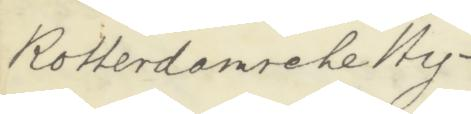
Rotterdamsche Hy-
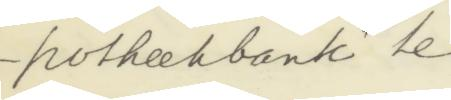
=potheekbank" te
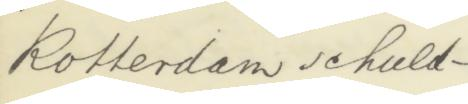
Rotterdam schuld-
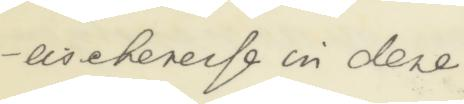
-eischeresse in deze
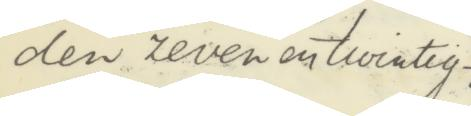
den zeven en twintig-
